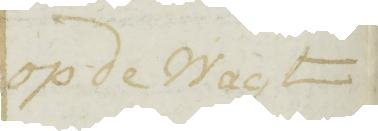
op de wagt
